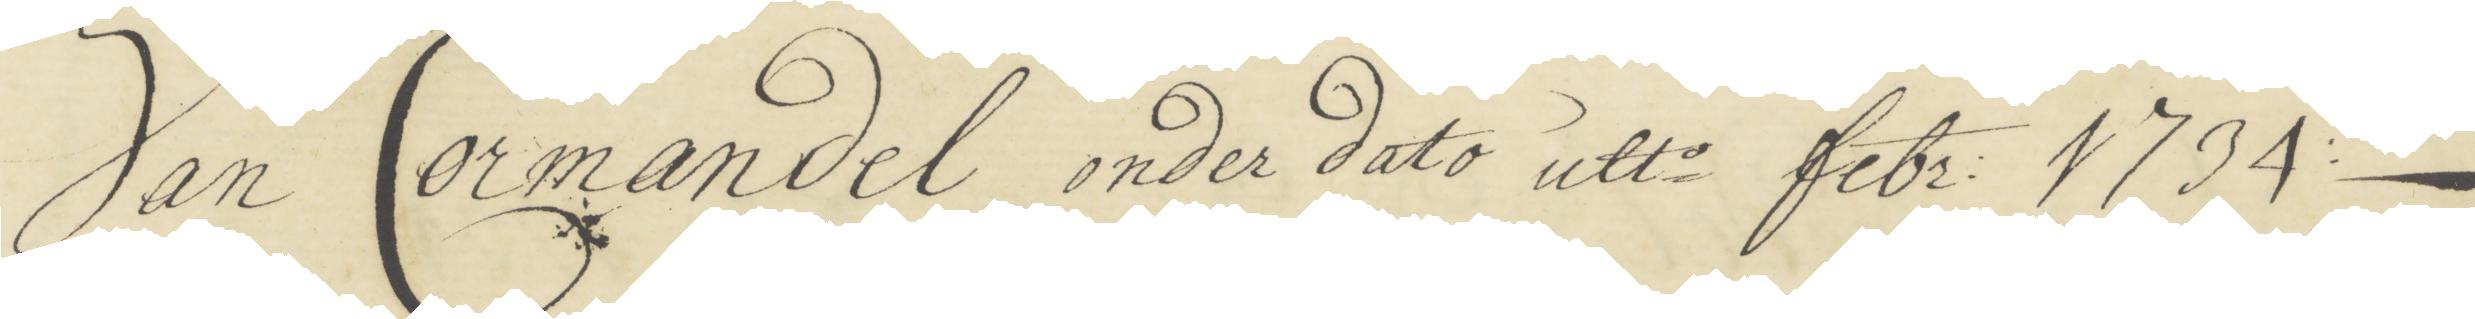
Van Cormandel onder dato ult=o febr: 1734:
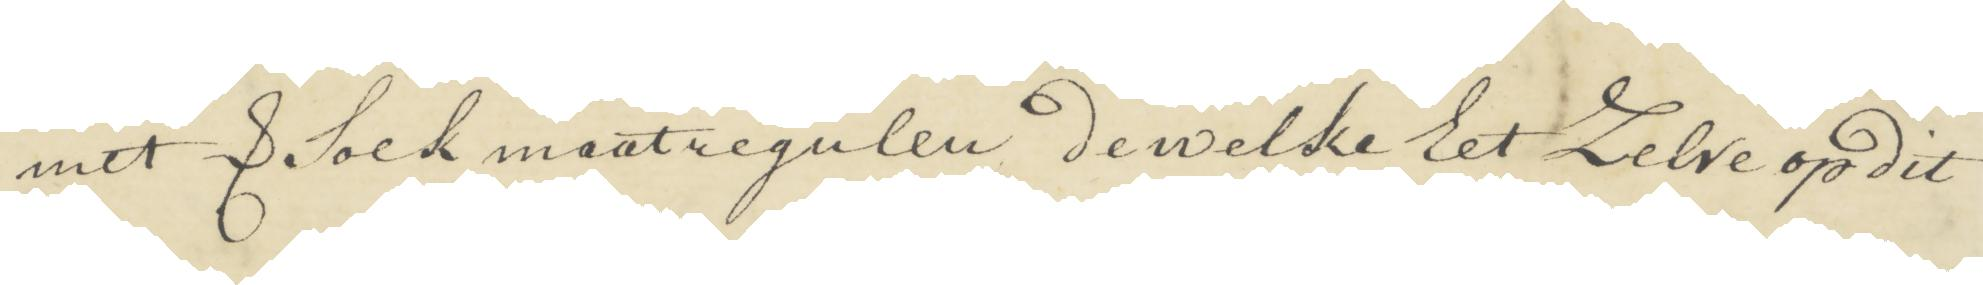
met versoek maatregulen, dewelke het zelve op dit
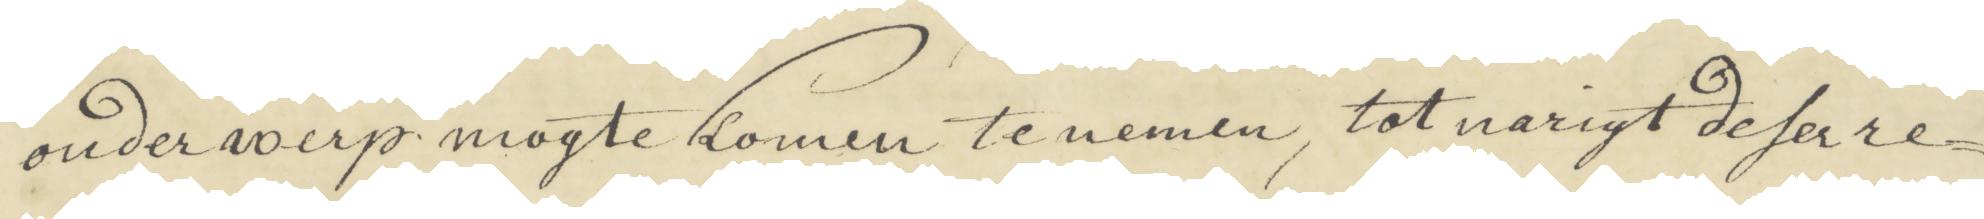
onderwerp mogte komen te nemen, tot narigt deser re=
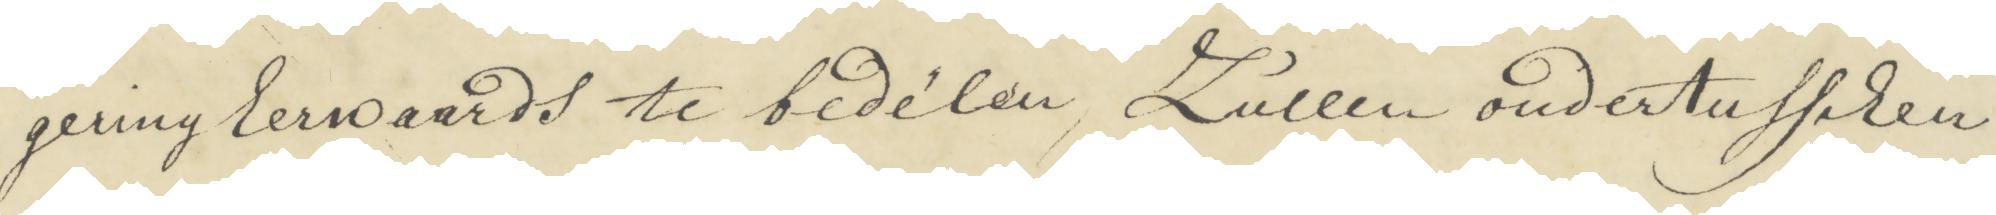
gering herwaards te bedelen, zullen ondertusschen
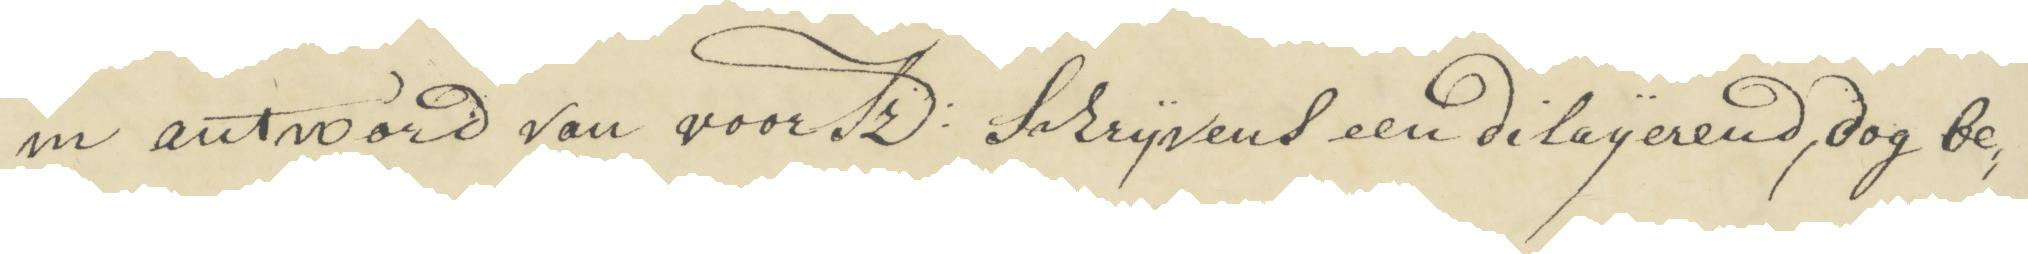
in antword van voorsz: schrijvens een dilaijerend, dog be„
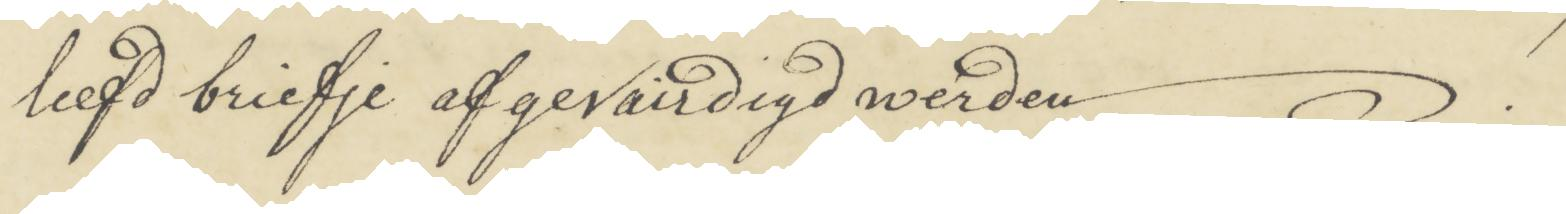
leefd briefje afgevairdigd werden
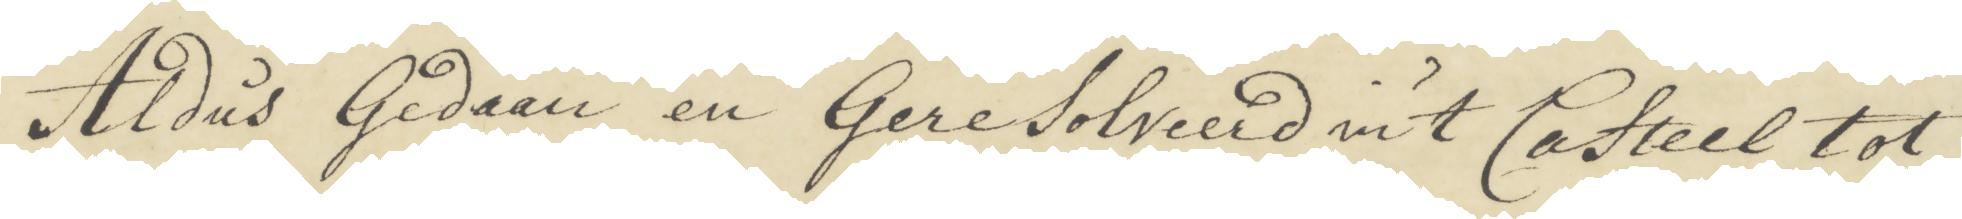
Aldus Gedaan en Geresolveerd in ’t Casteel tot
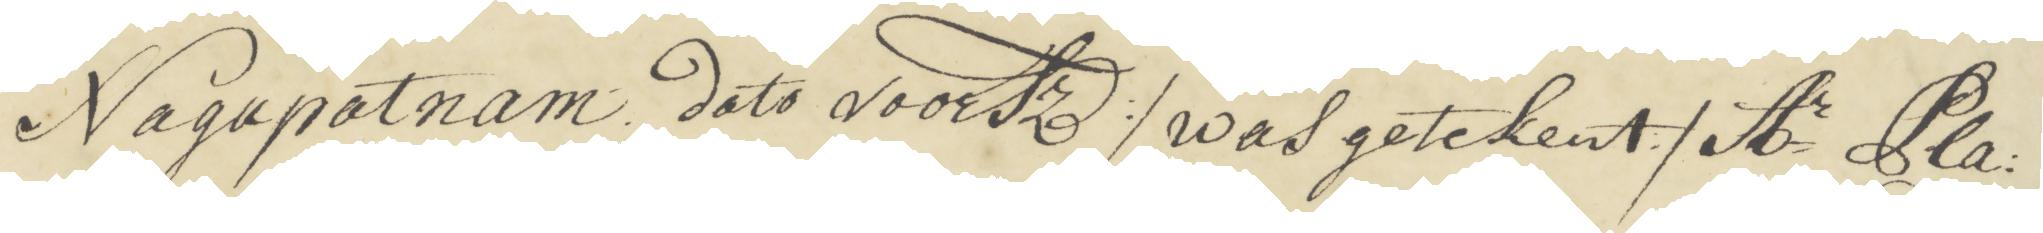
Nagapatnam dato voorsz: /was getekent:/ A=r Pla:
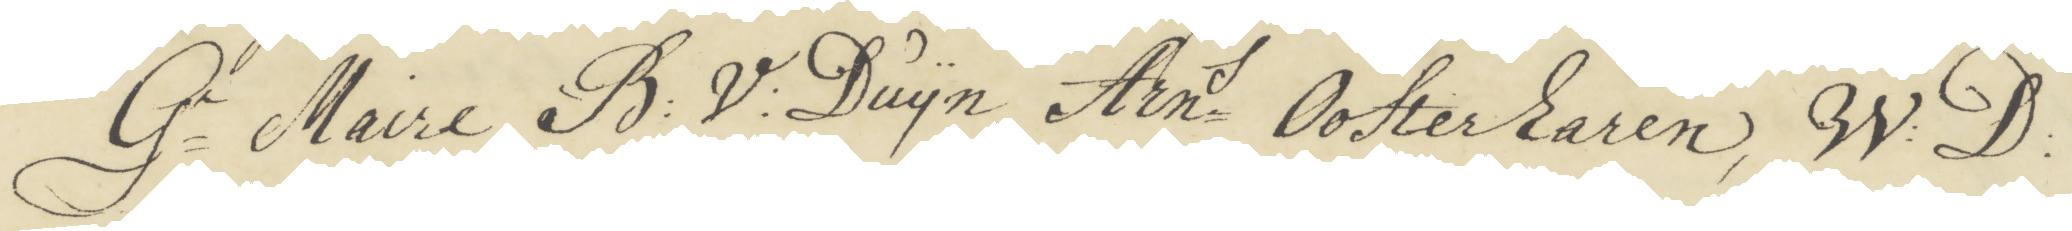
G=' Maire, B: V: Duijn, Arn=s Oosterharen, W: D:
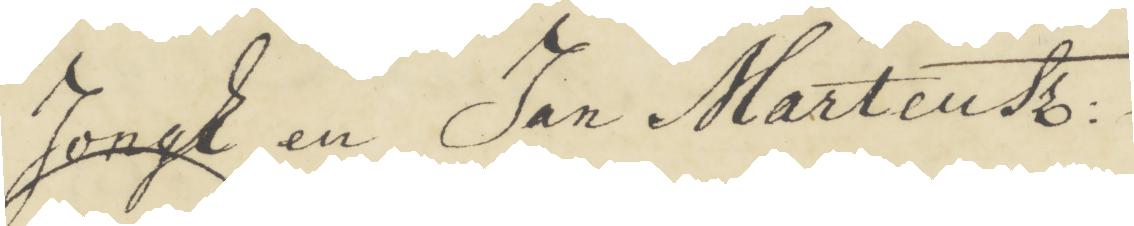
Jongh en Ian Martensz:
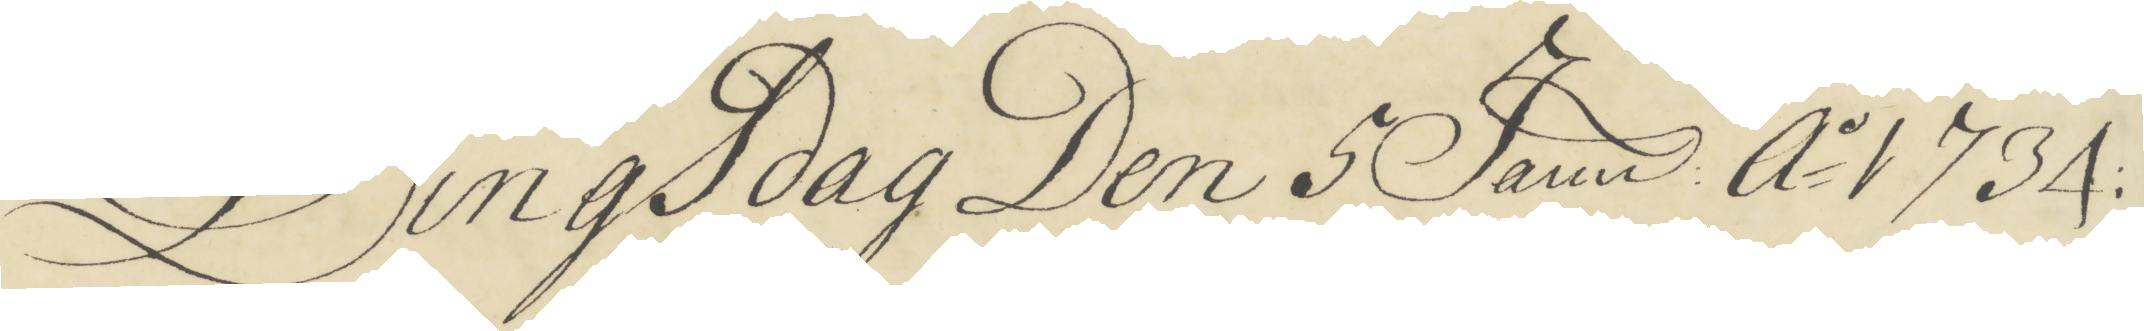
Dingsdag Den 5 Iann: A„o 1734:
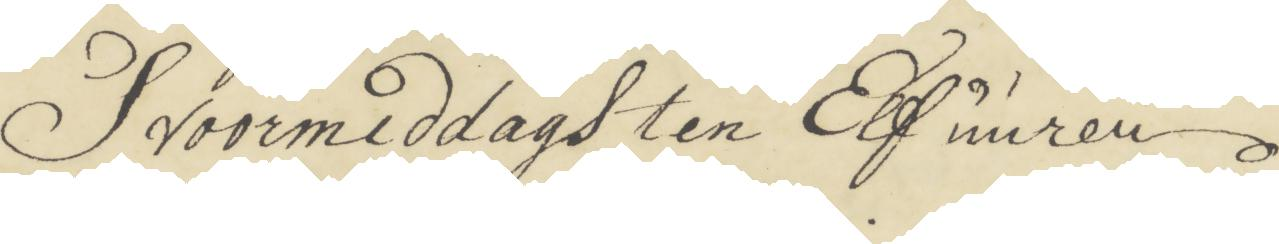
's voormiddags ten Elf uuren
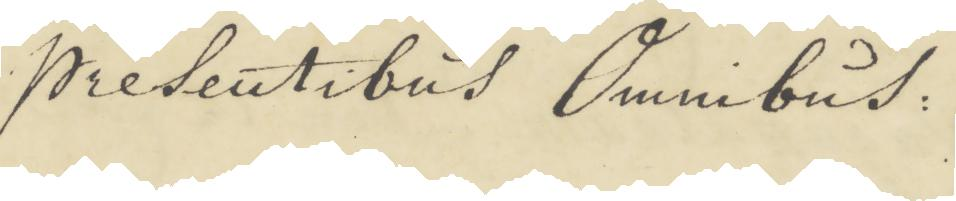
presentibus Omnibus:
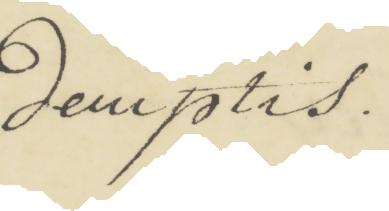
demptis.
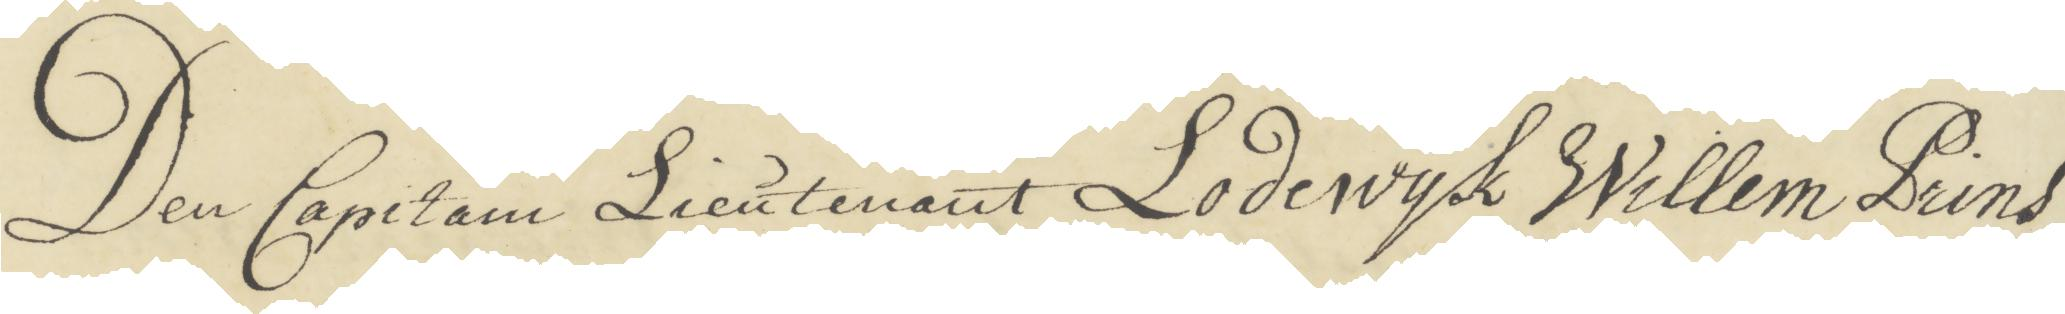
Den Capitain Lieutenant Lodewijk Willem Prins
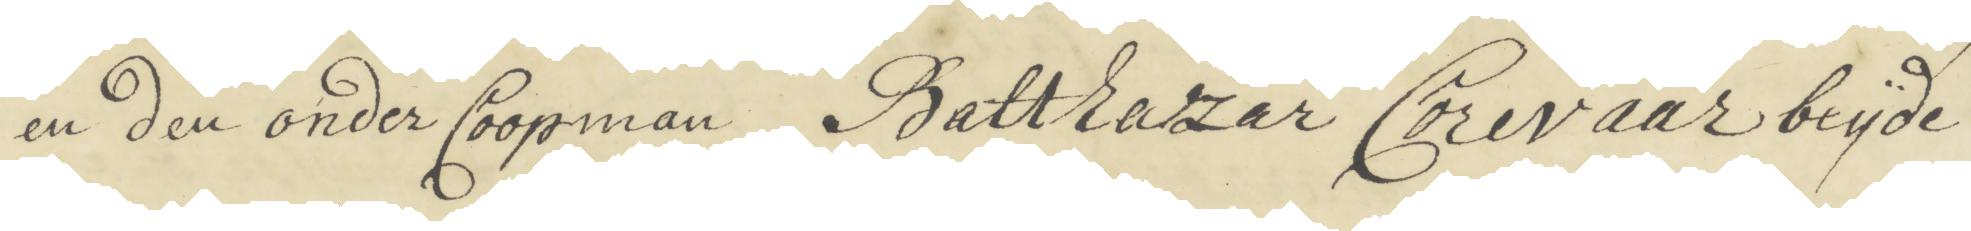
en den onder Coopman Balthazar Corevaar beijde
